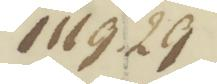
1119. 29
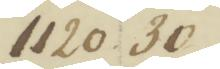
1120. 30
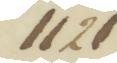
1121
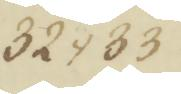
32 en 33
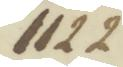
1122
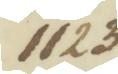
1123
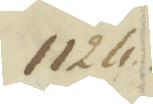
1124.
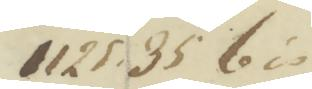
1125. 35 bis
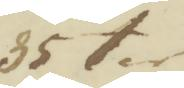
35 ter
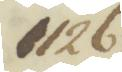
1126
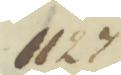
1127
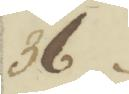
36 .
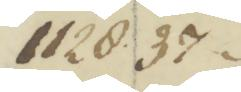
1128. 37
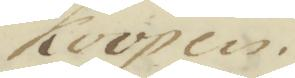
Koopen.
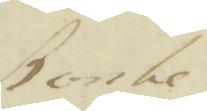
Bonke
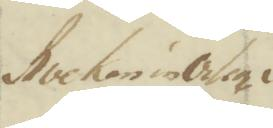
Boeken in Octavo
